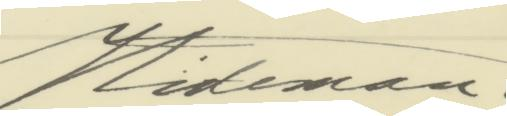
JTideman
